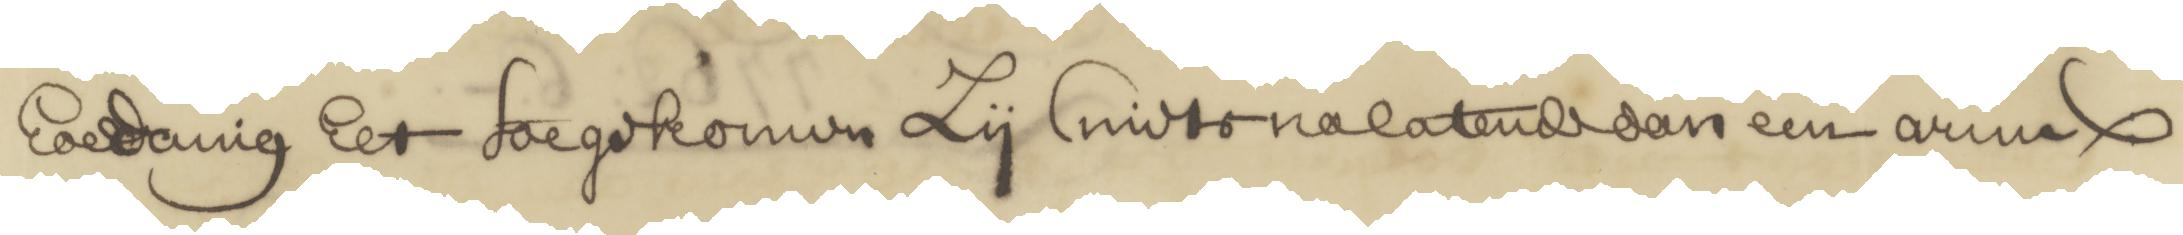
hoedanig het toegekomen zij (niets nalatendedan een arme
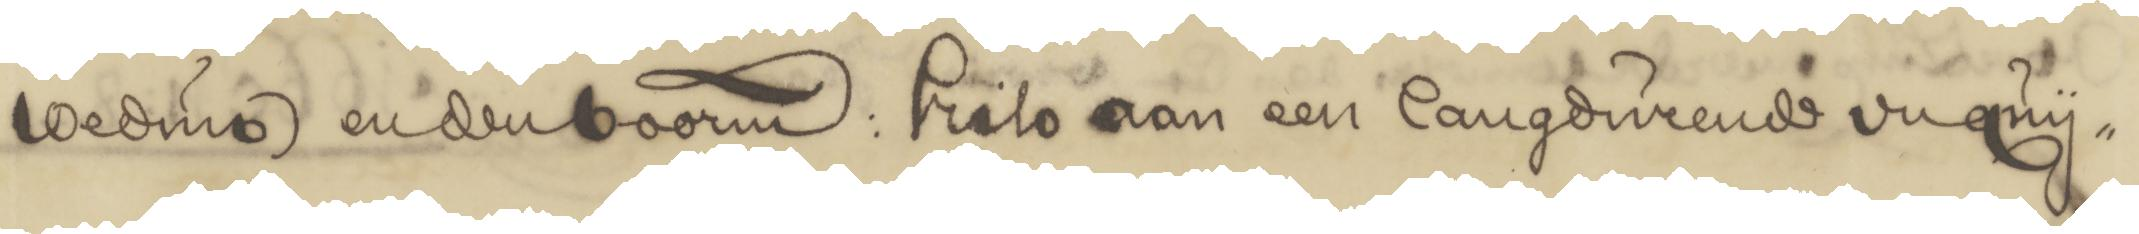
weduw) endenvoorm: kilo aan een langdurende enquij„
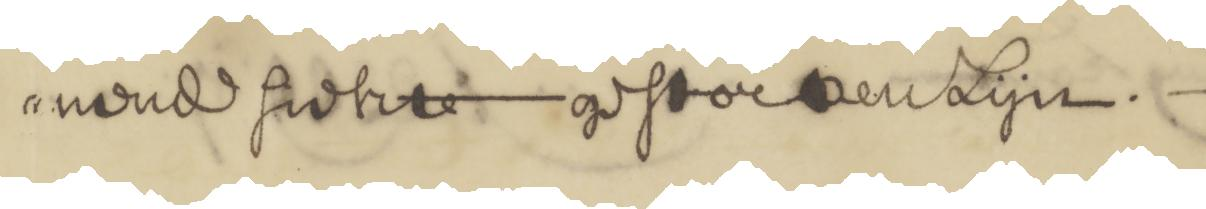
nende siekte gestorvenzijn.
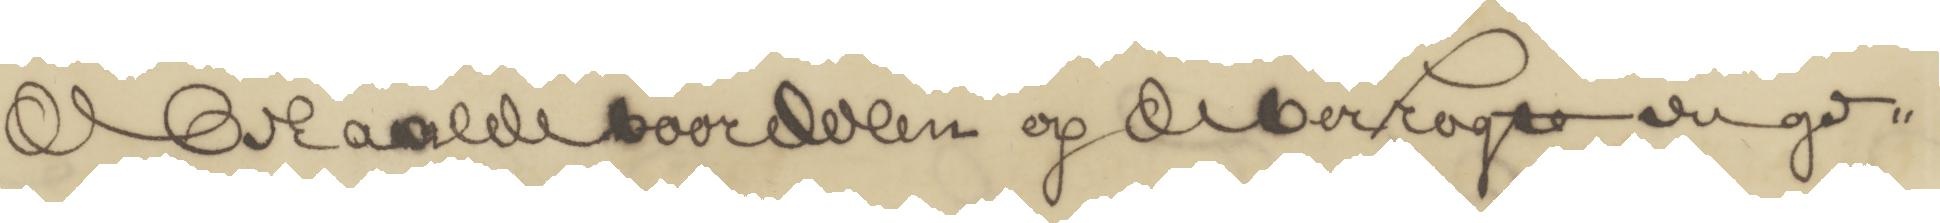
de behaaldevoordeelen op deverkogte en ge„
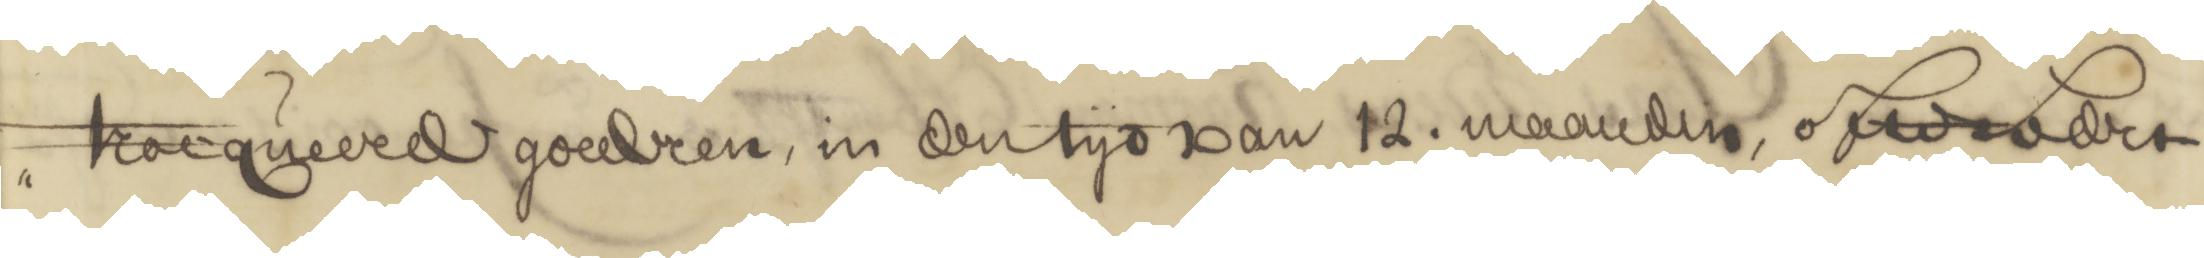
„trocqueerde goederen, in den tijd van 12. maanden, oftesedert
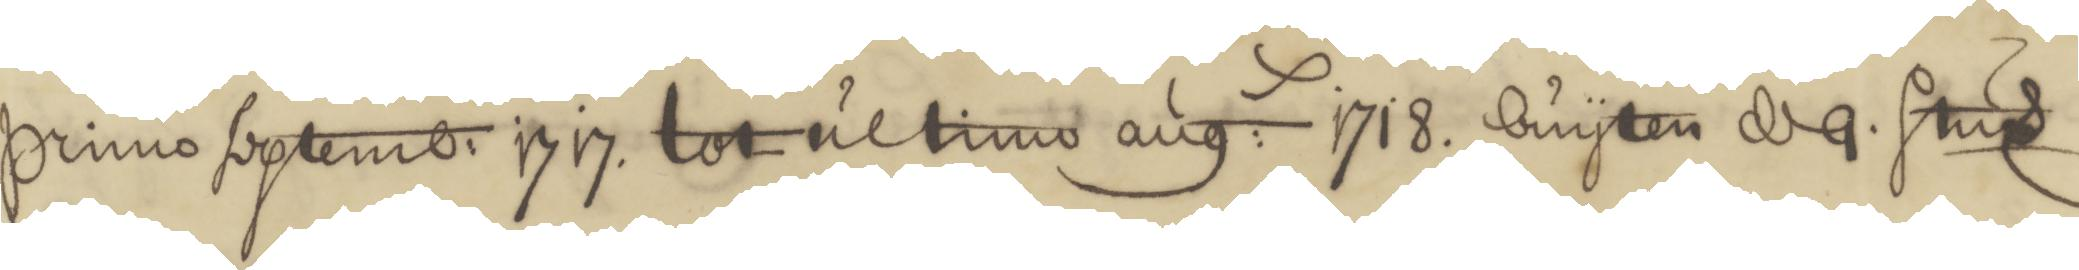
primo septemb: 1717. tot ultimo aug:s 1718. buijten de4. stux
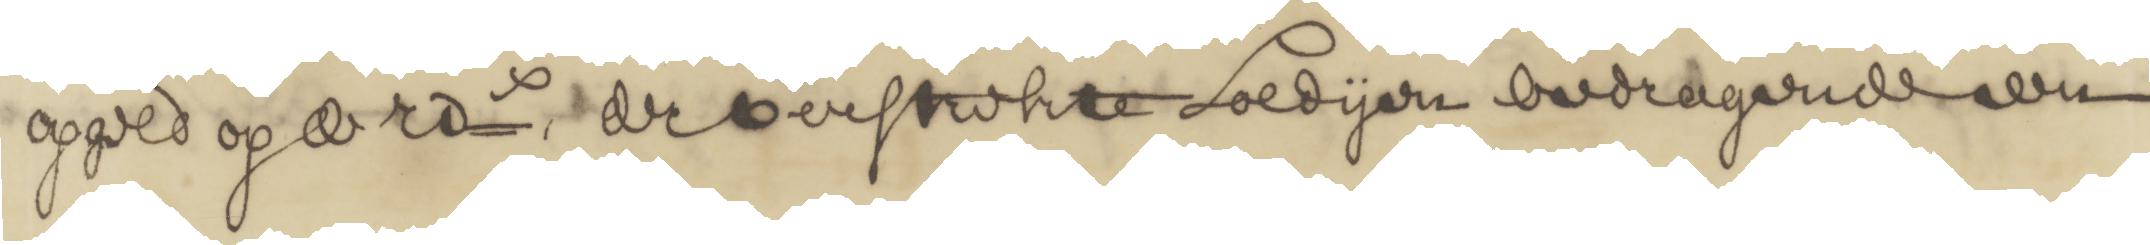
opgeld op de rd=s, derverstrekte soldijen bedragendeeen
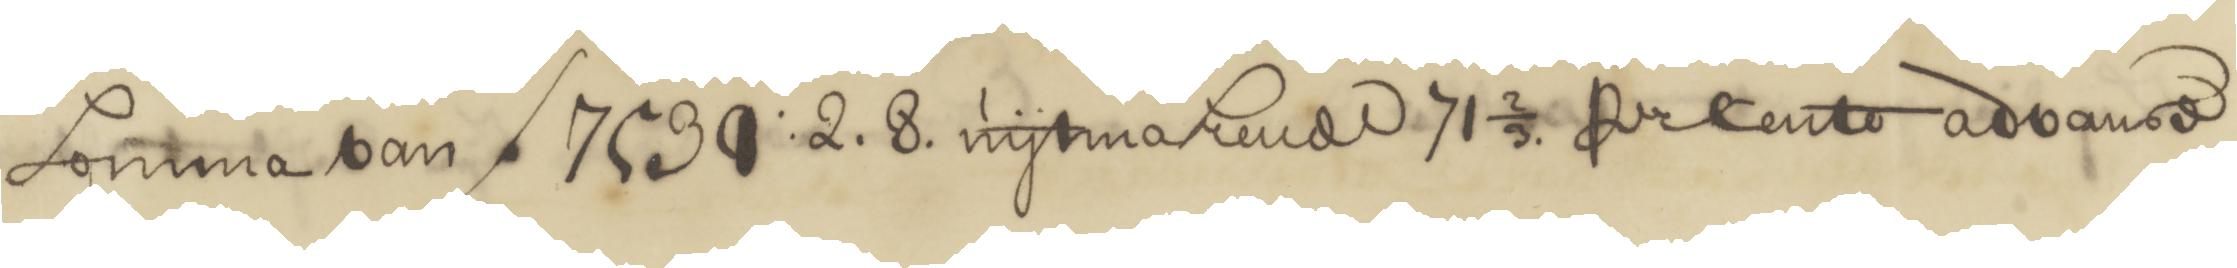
somma van ƒ7534:2.8. uijtmakende 71 2/3. percento advanse
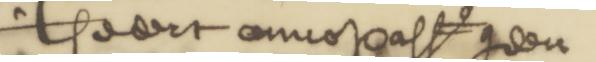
'tsedert annopass=o geen
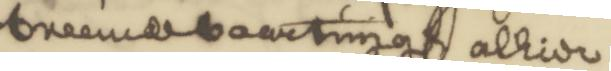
vreemdevaartuijgh alhier
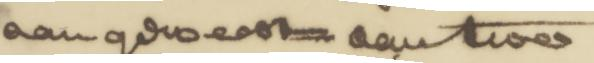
aan geweest dan twee
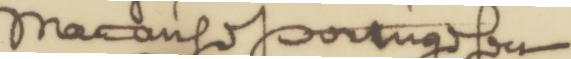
macauseportugeesen
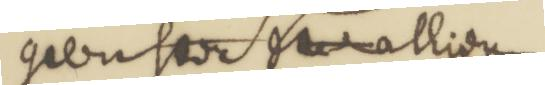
geensterfte alhier
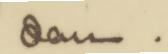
dan.
